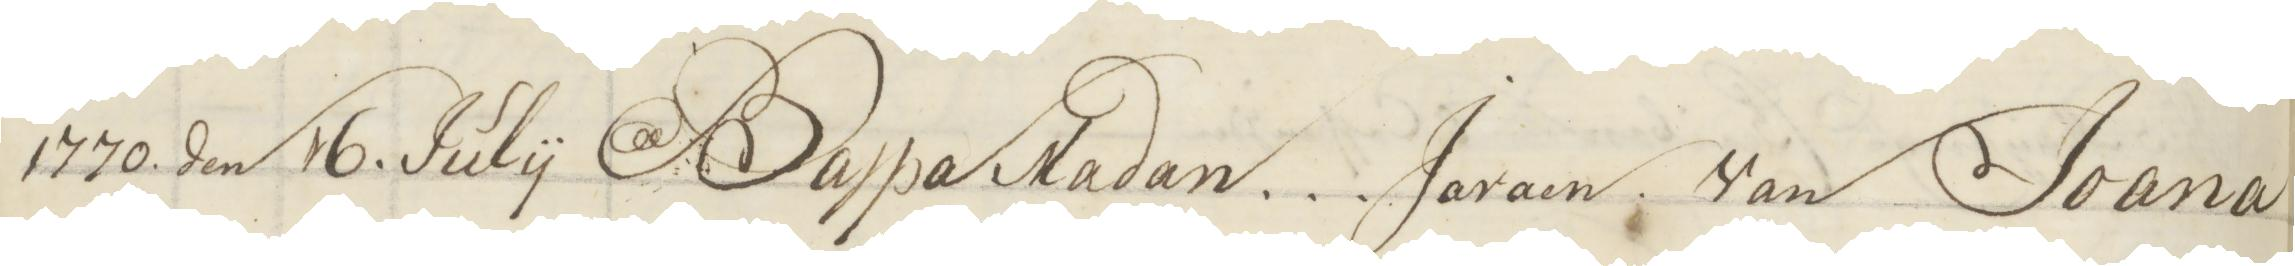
1770. den 16. Iulij Bappa Madan - - - Javaen - van Ioana
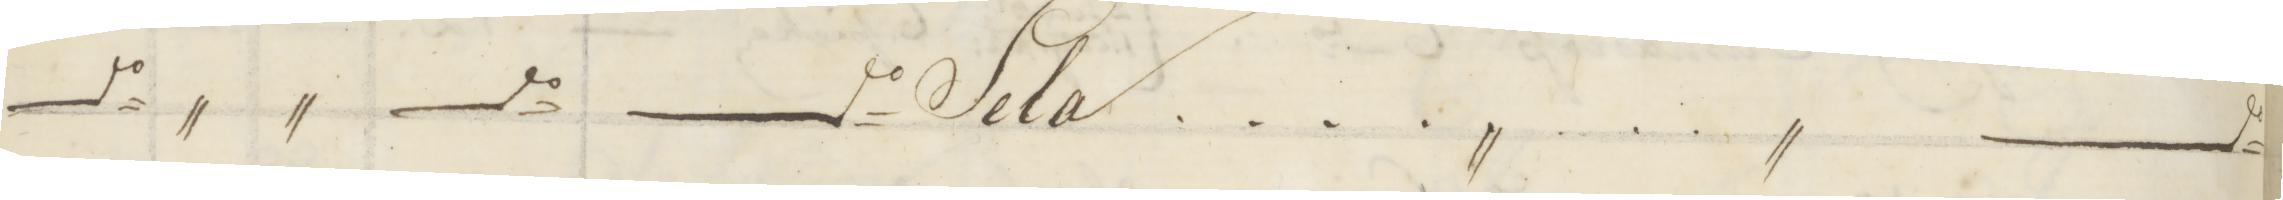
D=o „ „ D=o D=o Sela - - - - „ - - - „ D=o
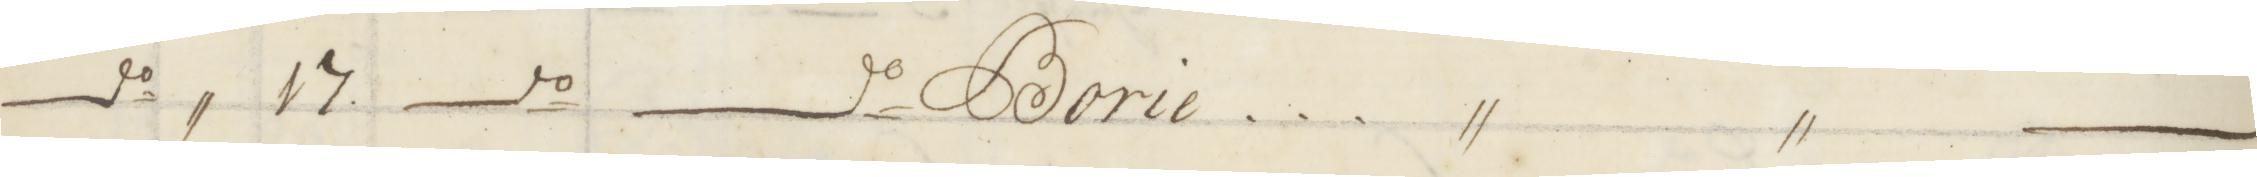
D=o „ 17. D=o D=o Borie - - - „ „ D:
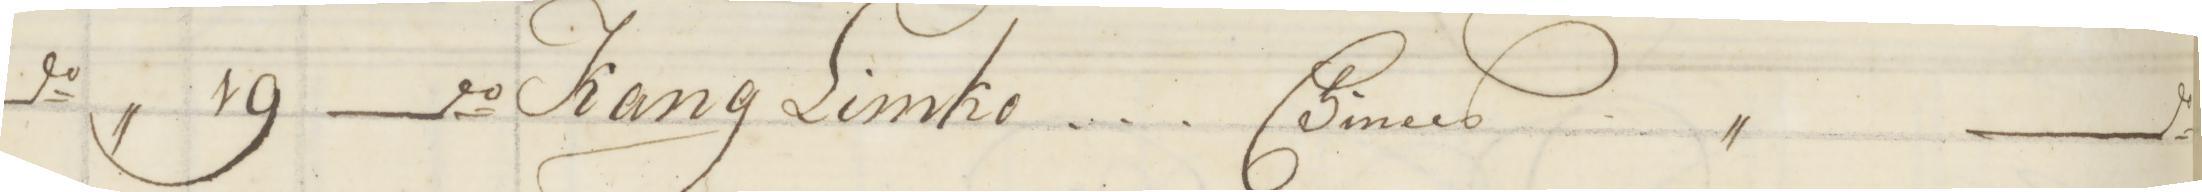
D=o „ 19 D=o Kang Limko - - - Chinees „ D=o
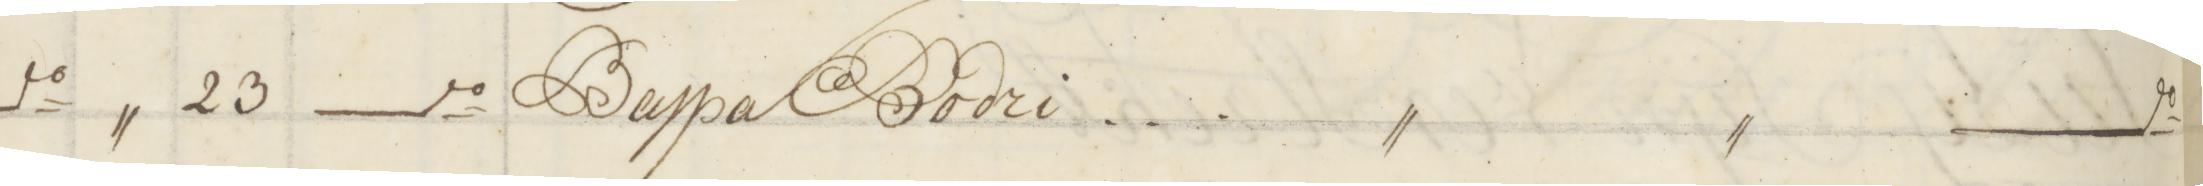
D=o „ 23 D=o Bappa Bodri - - - „ „ D=o
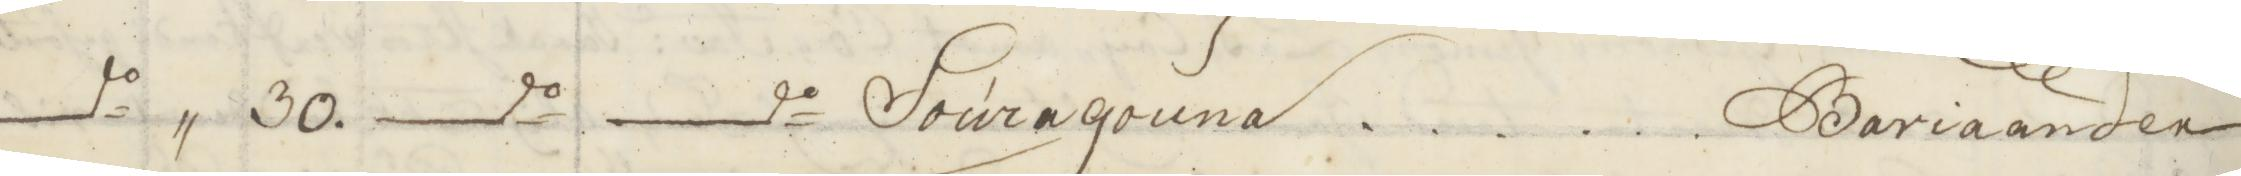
D=o „ 30. D=o D=o Souragouna - - - - - - Baviaander
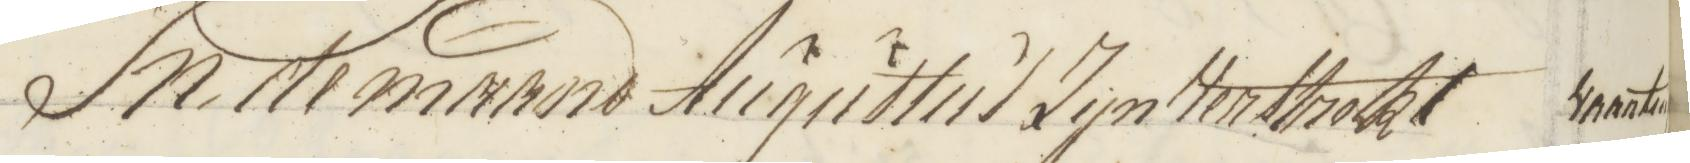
In de maand Augustus Zijn Verttrokt Vaartuy
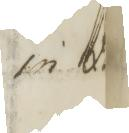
in S
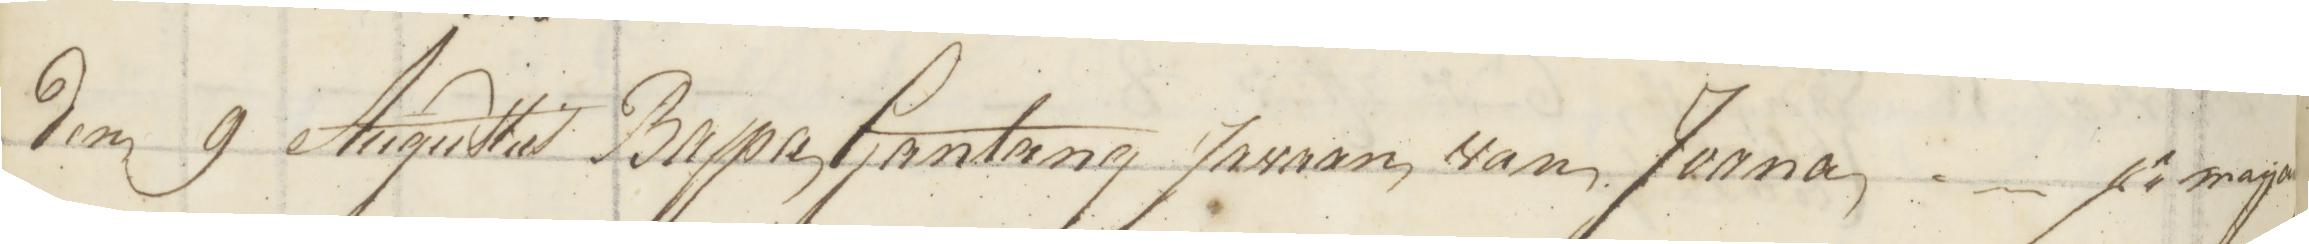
den 9 Augustus Bappa Gantang Javaan van Joana - - p„r maija
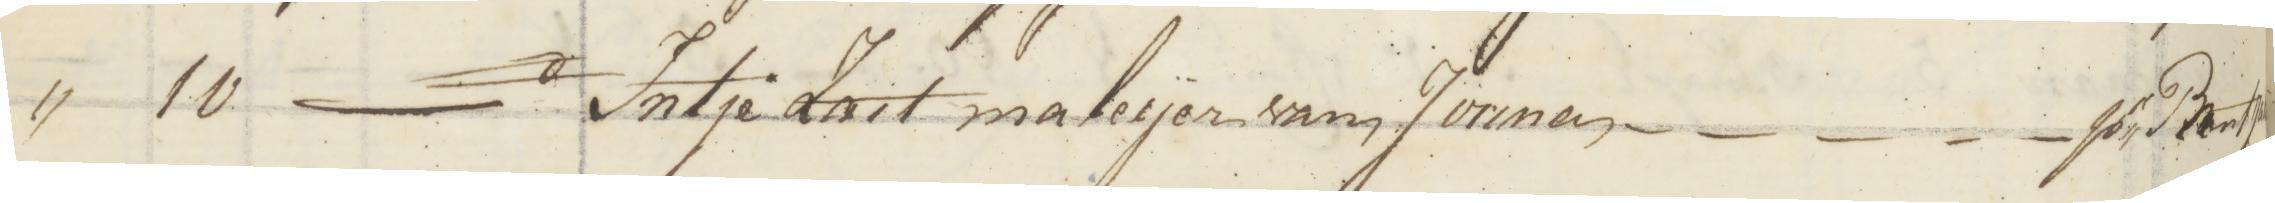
„ 10 — =o Intje Zait maleijer van Joana - - - - - p„r Pantj
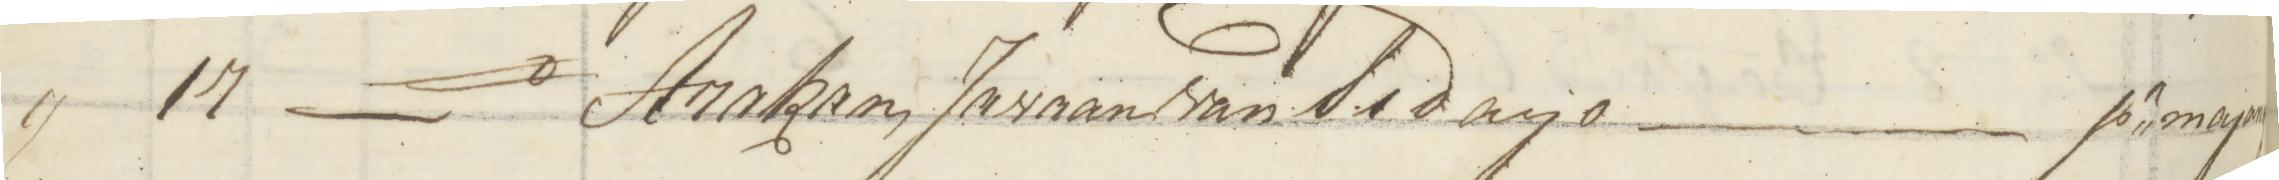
„ 17 — =o Arakan Javaan van sidaijo — p„r maijang
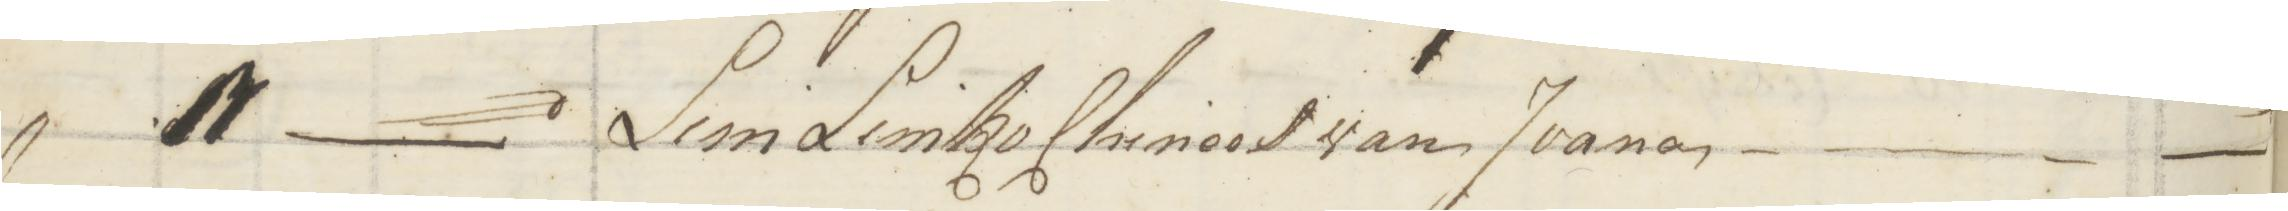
„ 11 — =o Lim Limko Chinees van Joana - — - —
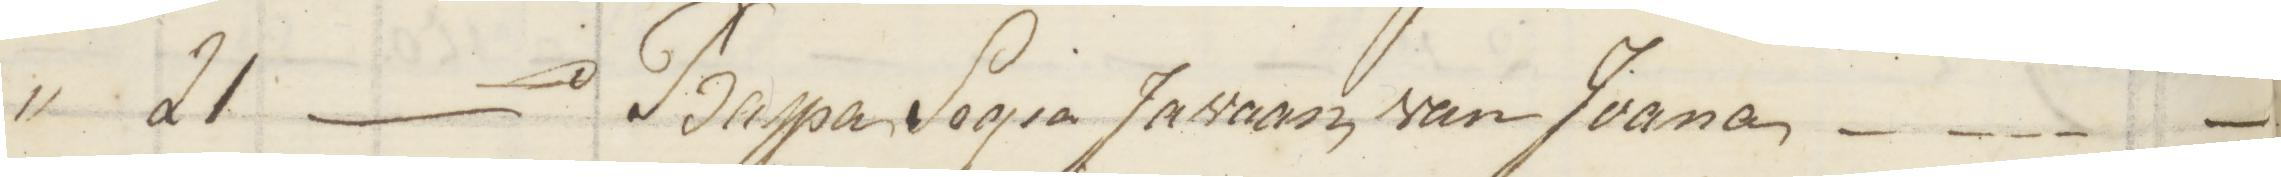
„ 21 — =o Bappa Sogia Javaan van Joana - - - - —
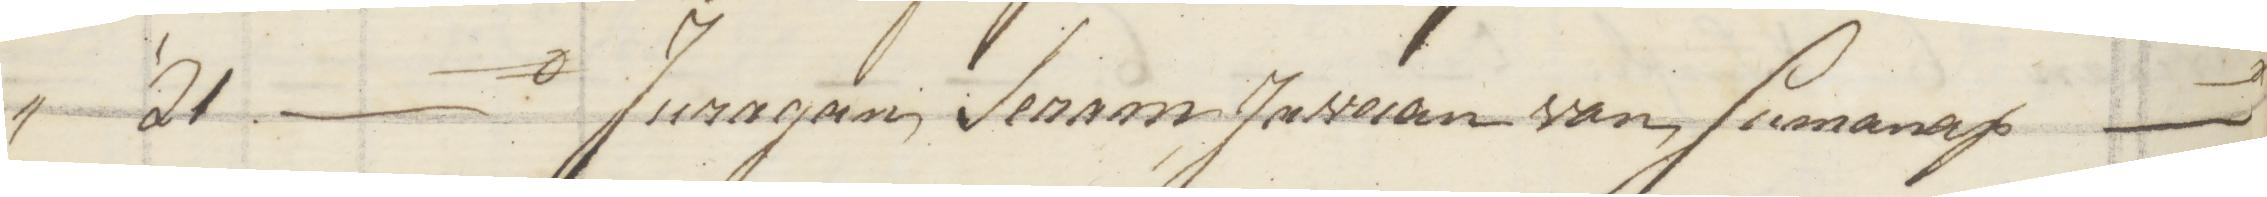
„ 21 — =o Juragan Seram Javaan van Sumanap —
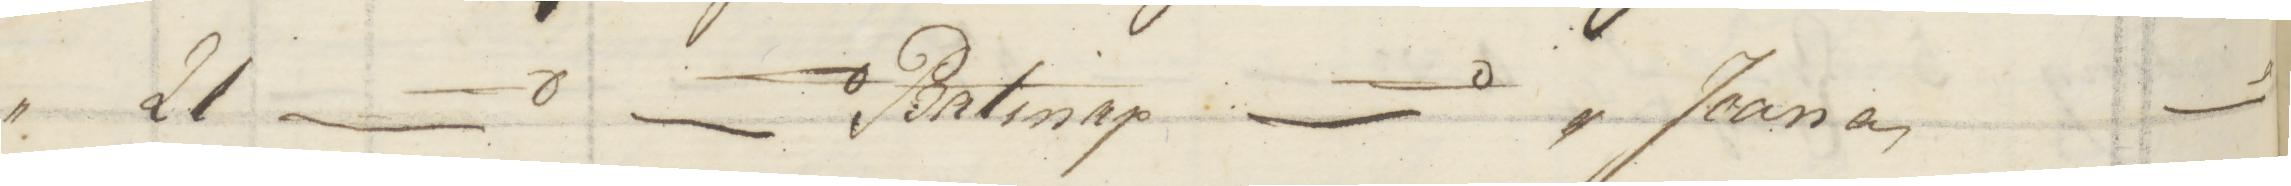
„ 21 — =o — =o Batinap —=o „ Joana —
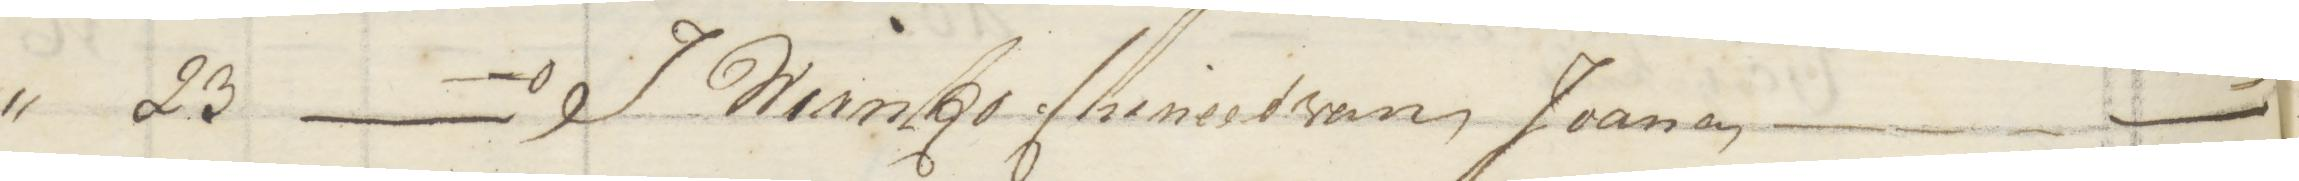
„ 23 — =o I Wirnko Chinees van Joana —
